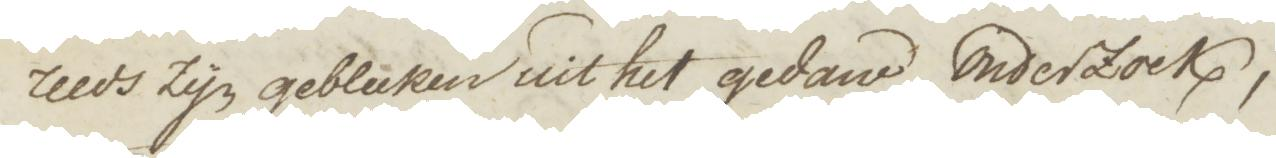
reeds zijn gebleeken uit het gedane onderzoek,
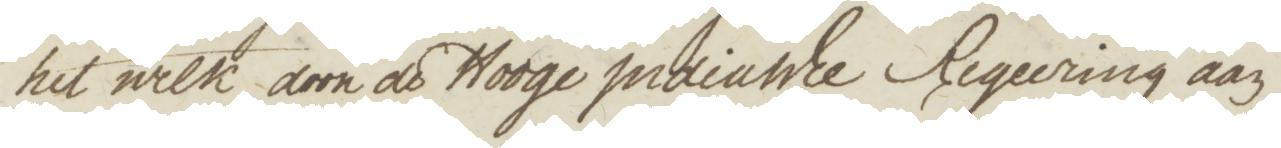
het welk door de Hooge jndiasche Regeering aan
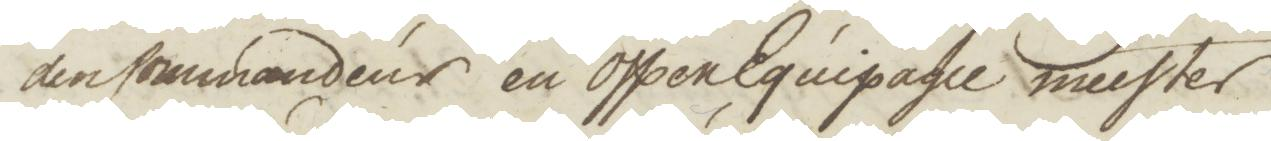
den Commandeur en opper Equipagie meester
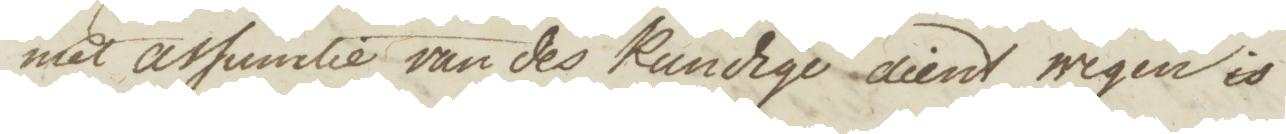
met assumtie van des kundige dient wegen is
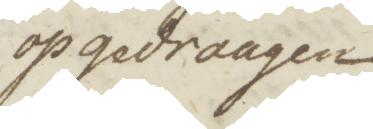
opgedraagen.
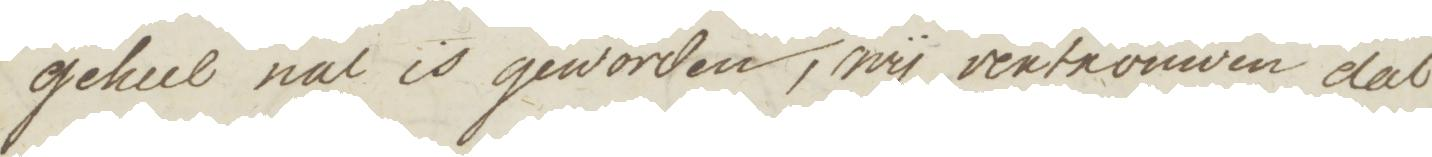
geheel nat is geworden, wij vertrouwen dat
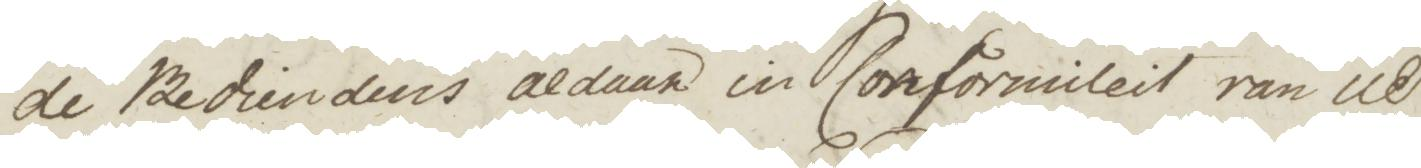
de Bediendens aldaar in Conformiteit van uE
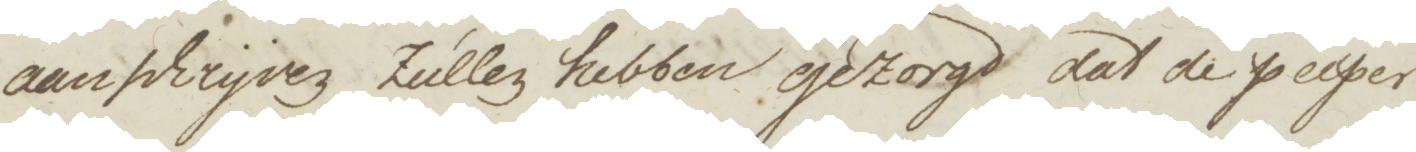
aanschrijven zullen hebben gezorgd dat de peeper
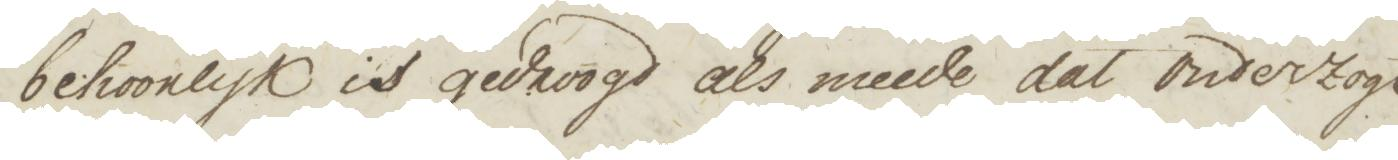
behoorlijk is gedroogd als meede dat onderzogt
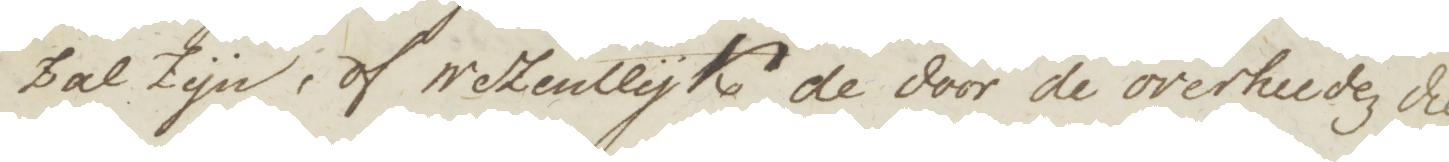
zal zijn, of wezentlijk de door de overheeden die
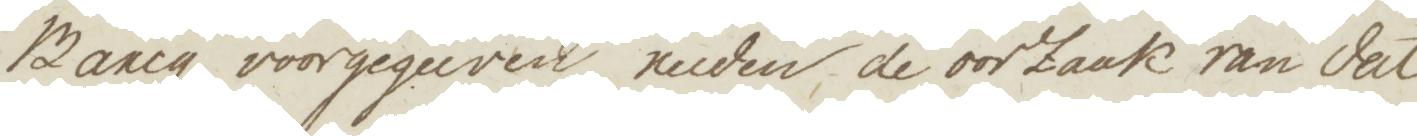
Barcq voorgegeeven reeden, de oorzaak van dat
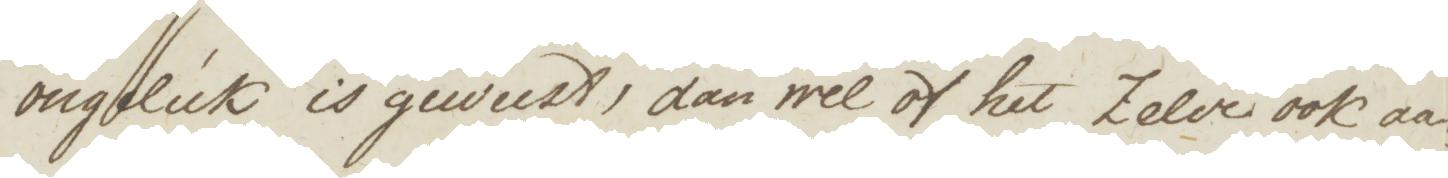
ongeluk is geweest, dan wel of het zelve ook aan
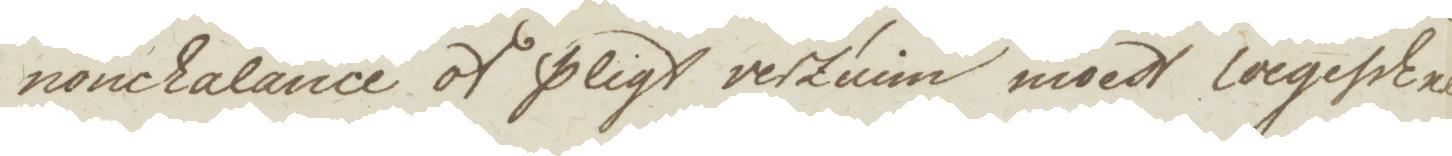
nonchalance of pligt verzuim moest toegeschre
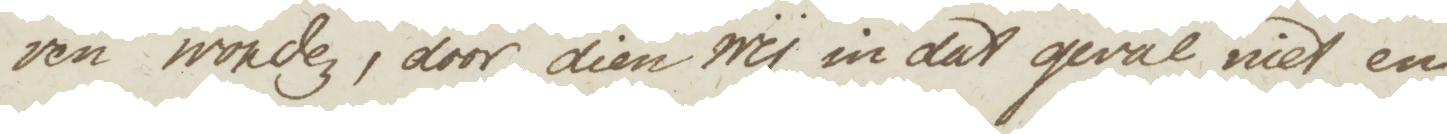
ven worden, door dien wij in dat geval niet en
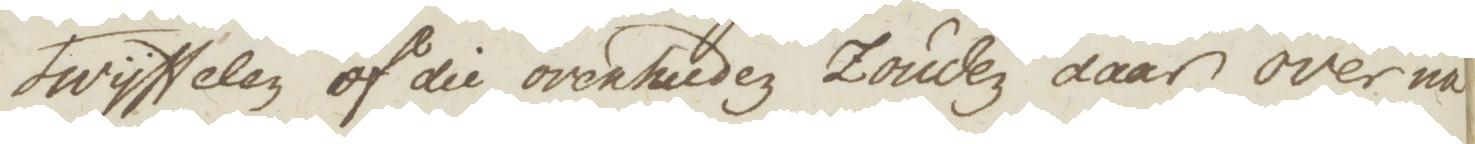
twijffelen of die overheeden zouden daar over na
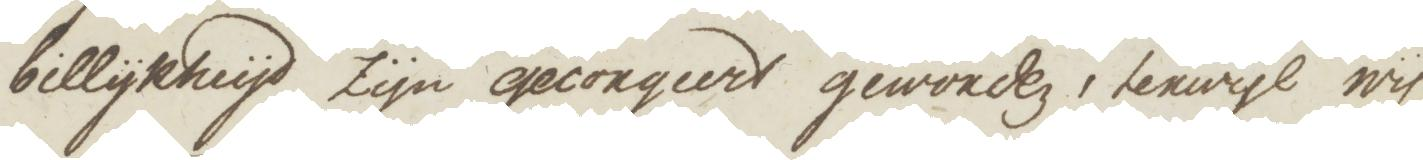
billijkheijd zijn gecorgeert geworden, terwijl wij
